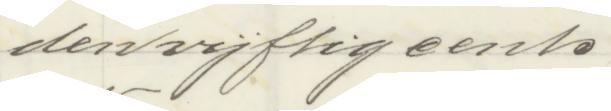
den vijftig cents
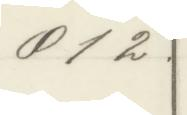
812.
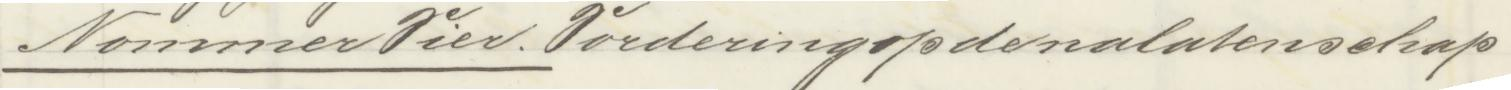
Nommer Vier. Vordering op de nalatenschap
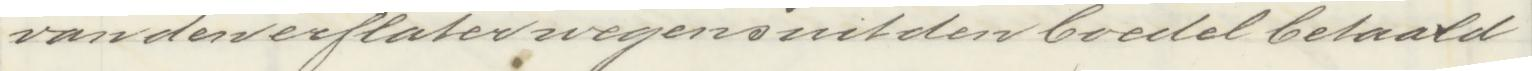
van den erflater wegens uit den boedel betaald
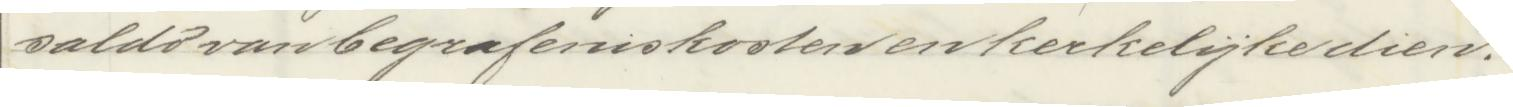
saldo van begrafeniskosten en kerkelijke dien.
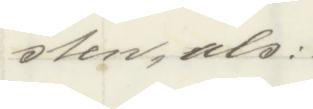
sten, als:
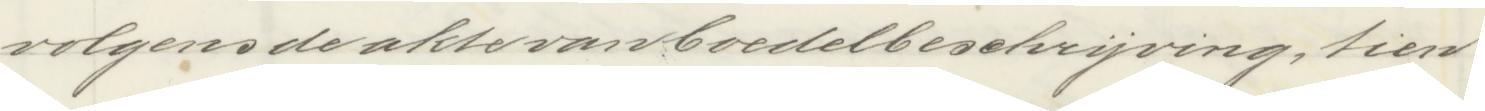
volgens de akte van boedelbeschrijving, tien
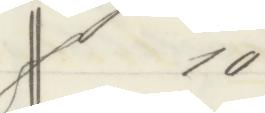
ƒ 10
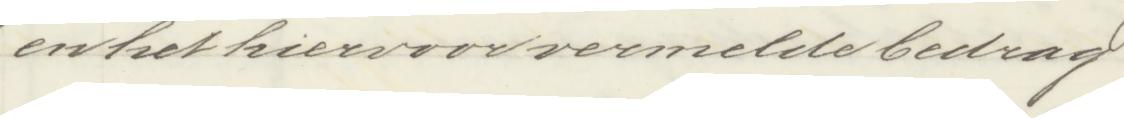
en het hiervoor vermelde bedrag
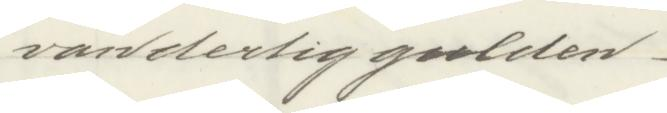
van dertig gulden
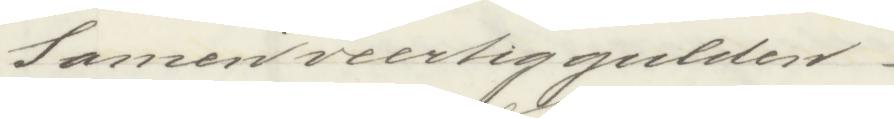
samen veertig gulden
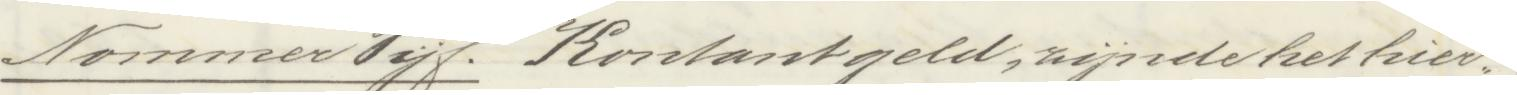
Nommer Vijf. Kontant geld, zijnde het hier„
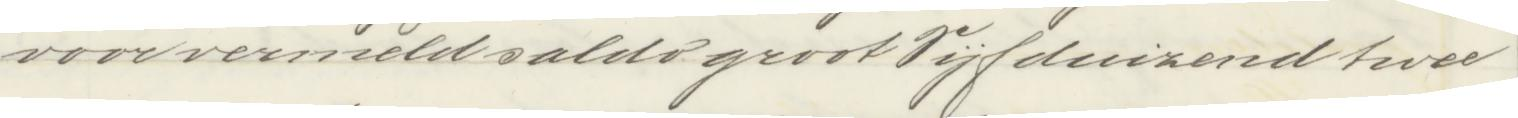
voor vermeld saldo groot Vijf duizend twee
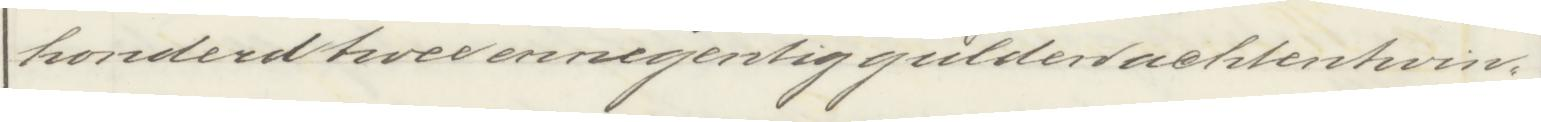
honderd twee ennegentig gulden achtentwin„
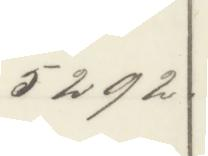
5292
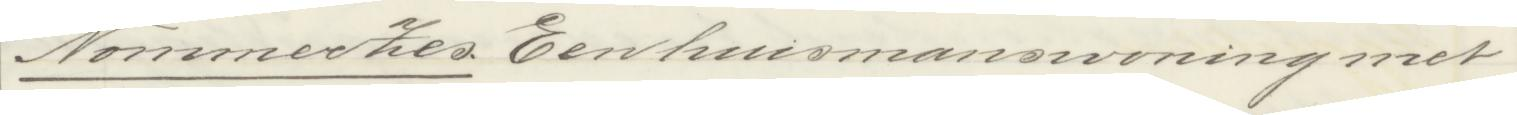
Nommer Zes. Een huismanswoning met
